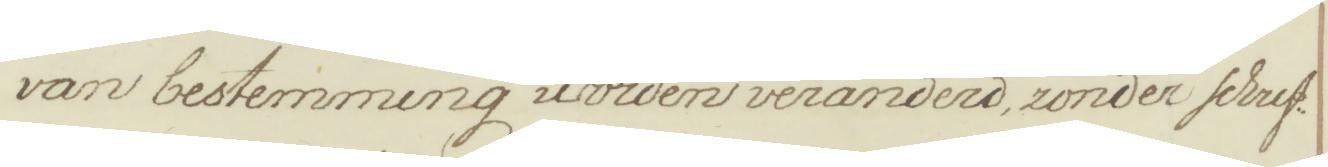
van bestemming worden veranderd, zonder schrif„
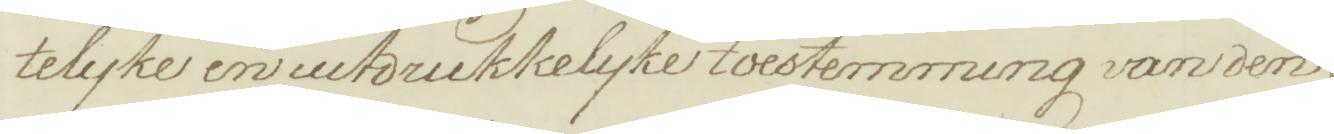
telyke en uitdrukkelyke toestemming van den
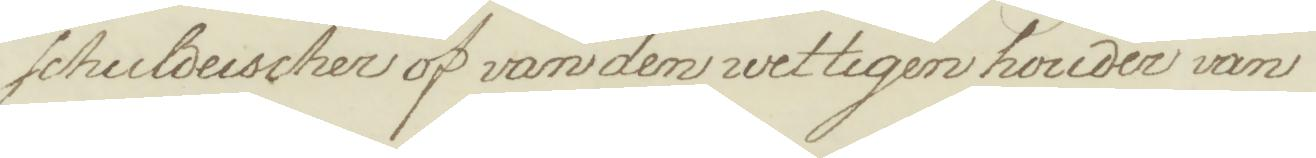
schuldeischer of van den wettigen houder van
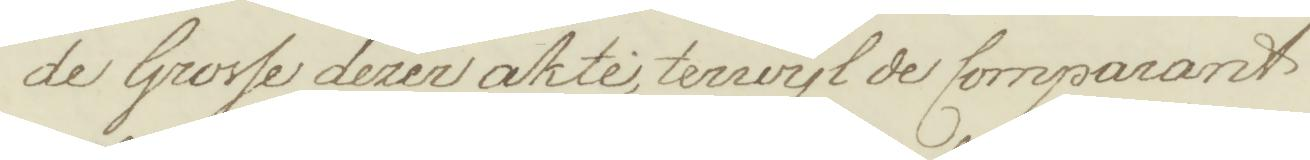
de Grosse dezer akte, terwyl de Comparant
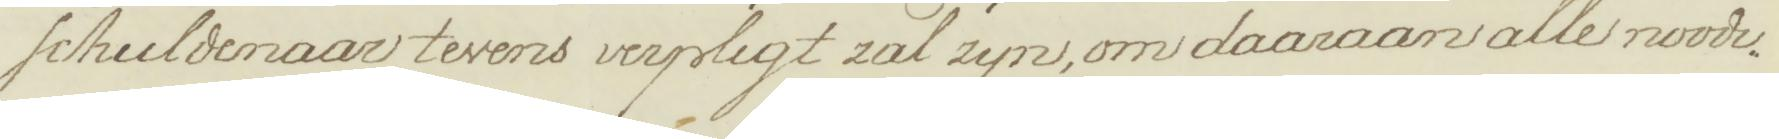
schuldenaar tevens verpligt zal zyn, om daaraan alle noodi„
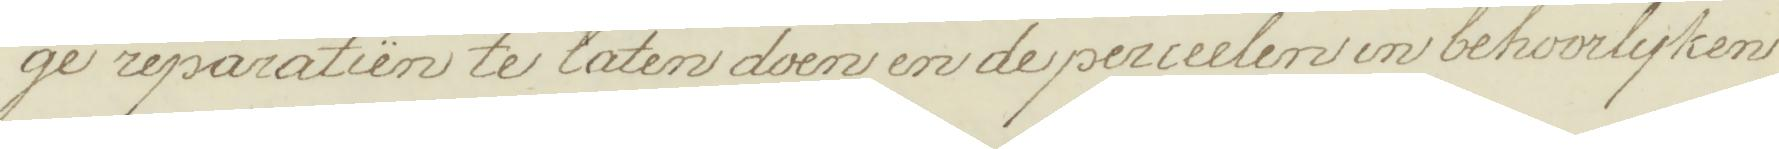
ge reparatiën te laten doen en de perceelen in behoorlyken
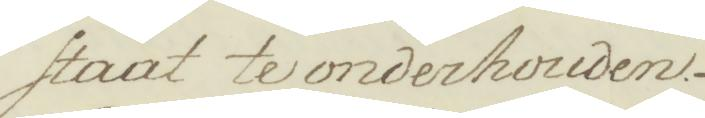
staat te onderhouden..
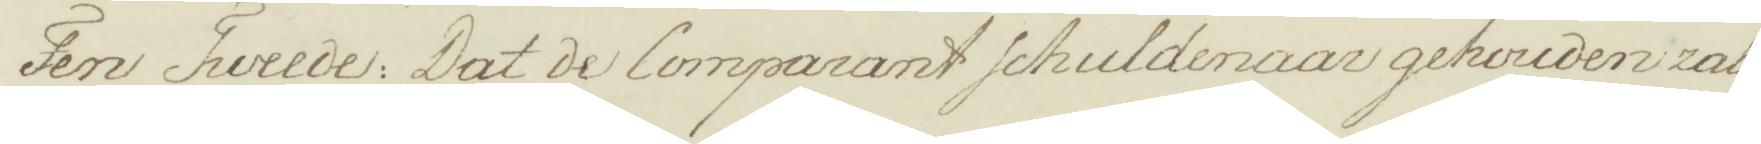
Ten Tweede: Dat de Comparant Schuldenaar gehouden zal
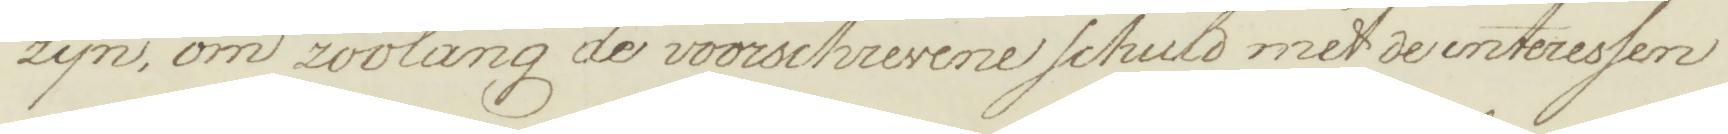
zyn, om zoolang de voorschrevene schuld met de interessen
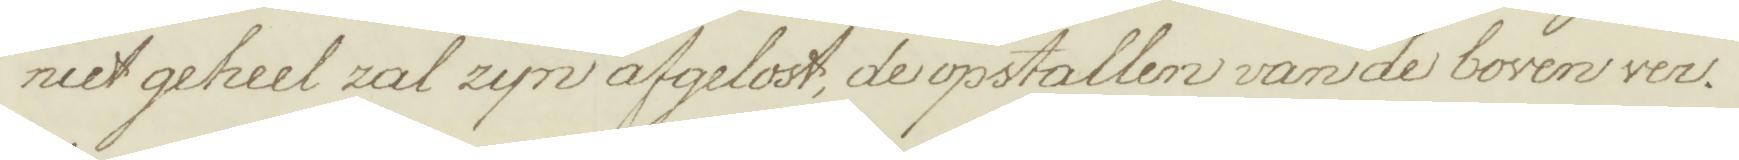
niet geheel zal zyn afgelost, de opstallen van de boven ver„
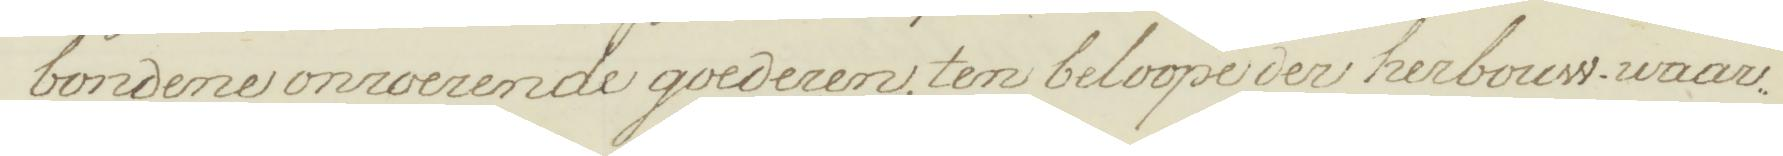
bondene onroerende goederen, ten beloope der herbouw waar„
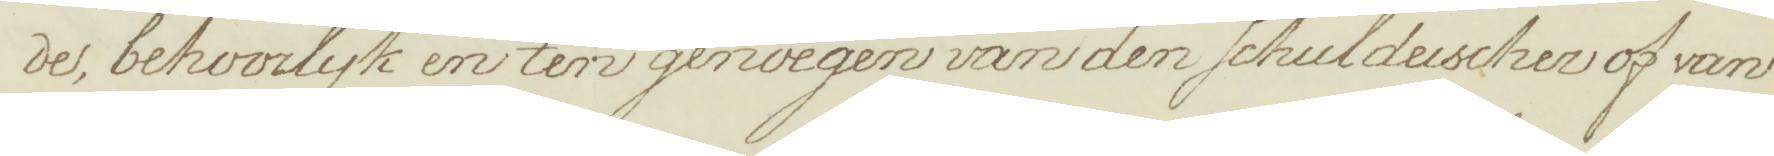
de, behoorlyk en ten genoegen van den schuldeischer of van
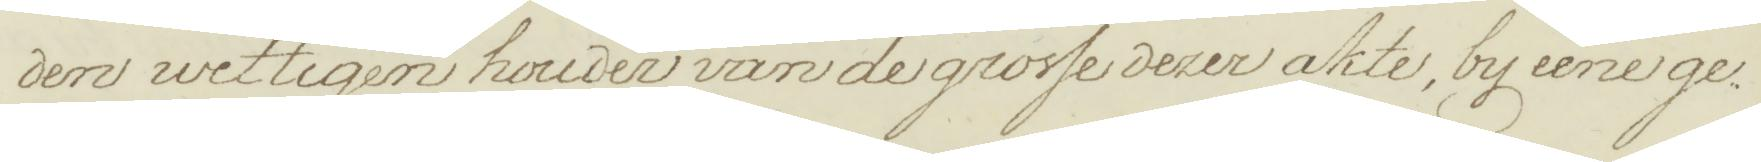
den wettigen houder van de grosse dezer akte, by eene ge„
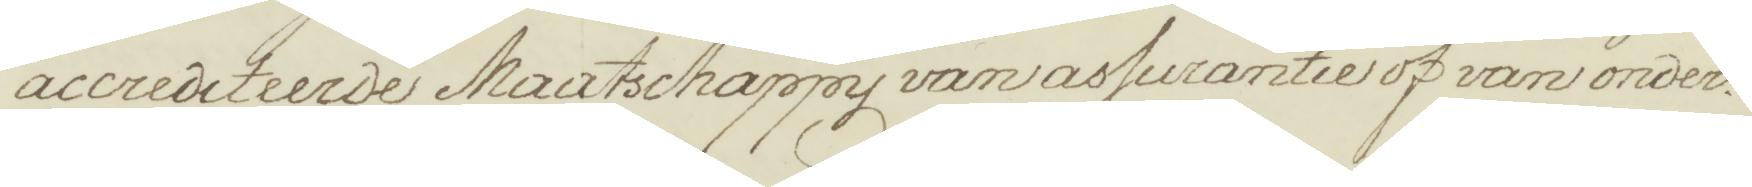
accrediteerde Maatschappy van assurantie of van onder„
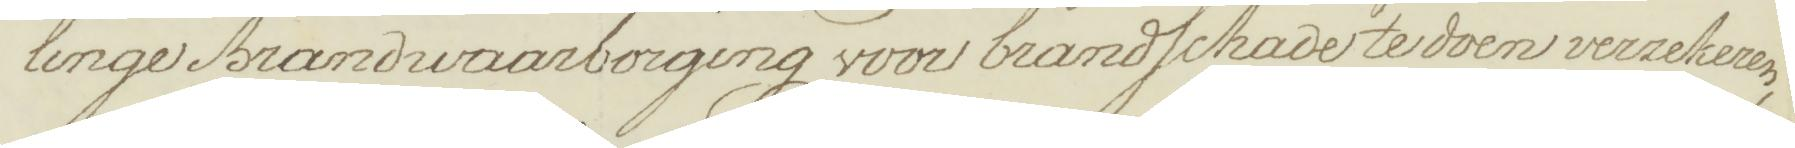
linge Brandwaarborging voor brandschade te doen verzekeren
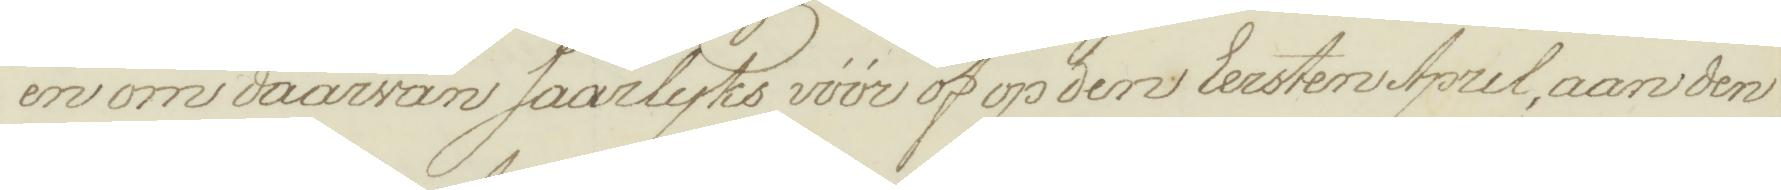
en om daarvan Jaarlyks vóór of op den Eersten April, aan den
